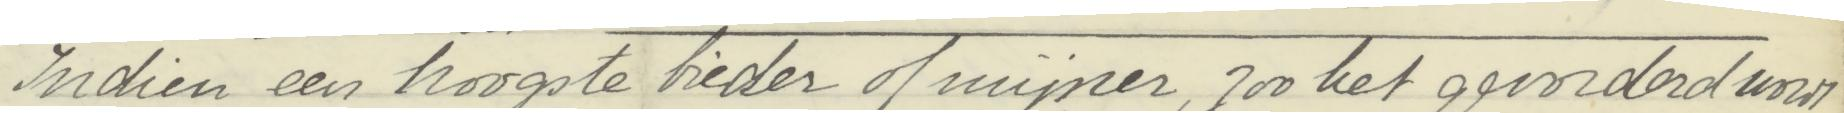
Indien een hoogste bieder of mijner, zoo het gevorderd wordt,
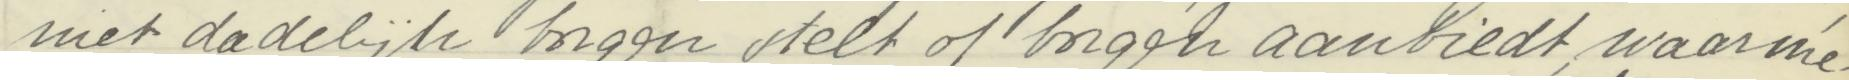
niet dadelijk borgen stelt of aanbiedt, waarme
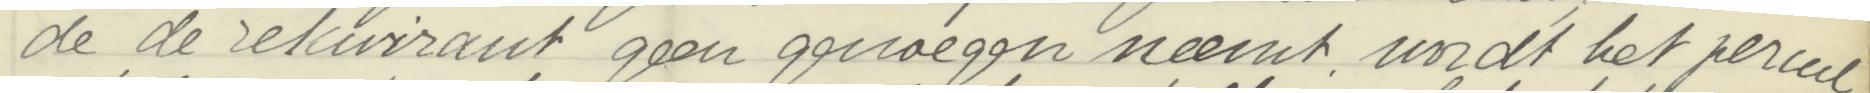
de de rekwirant geen genoegen neemt, wordt het perceel
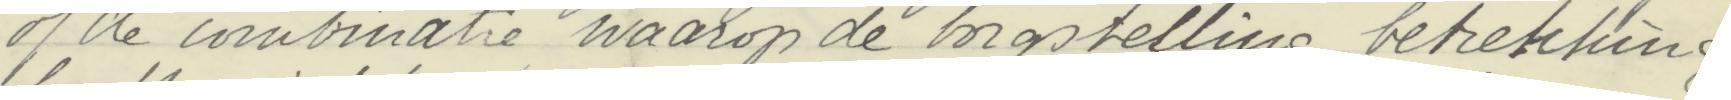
of de combinatie waarop de borgstelling betrekking
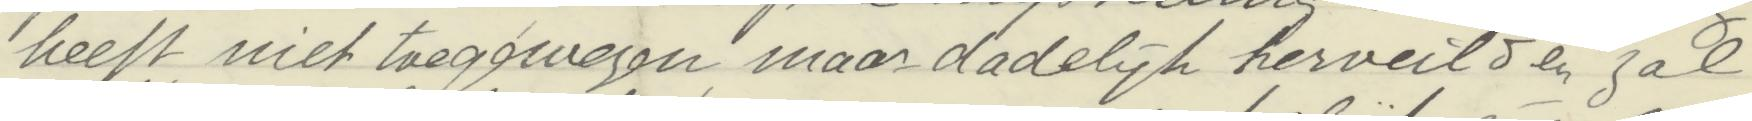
heeft, niet toegewezen maar dadelijk herveild en zal
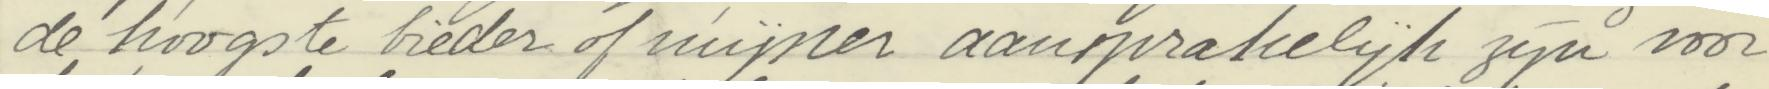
de hoogste bieder of mijner aansprakelijk zijn voor
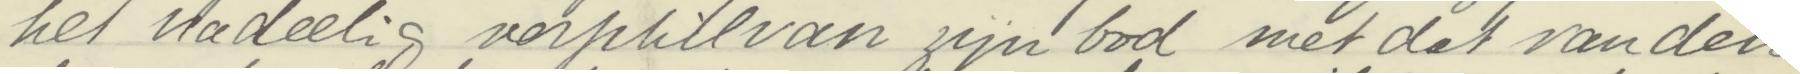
het nadeelig verschil van zijn bod met dat van den
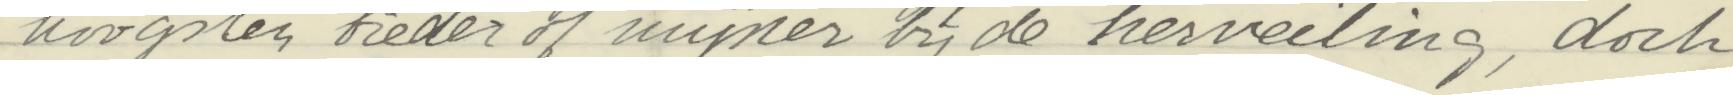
hoogsten bieder of mijner bij de herveiling, doch
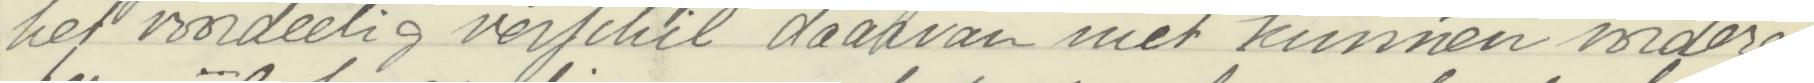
het voordeelig verschil daarvan niet kunnen vorderen
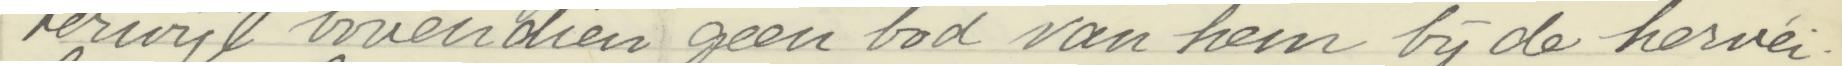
terwijl bovendien geen bod van hem bij de hervei-
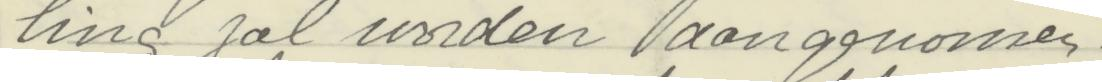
ling zal worden aangenomen
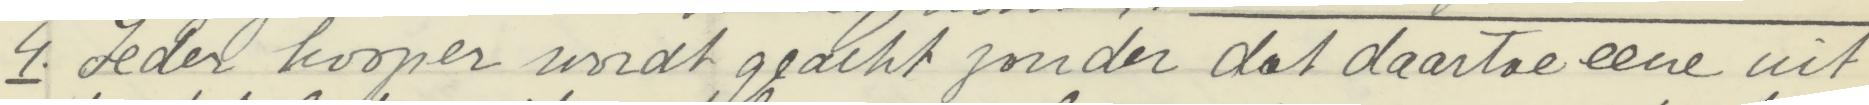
4. Ieder kooper wordt geacht zonder dat daartoe eene uit
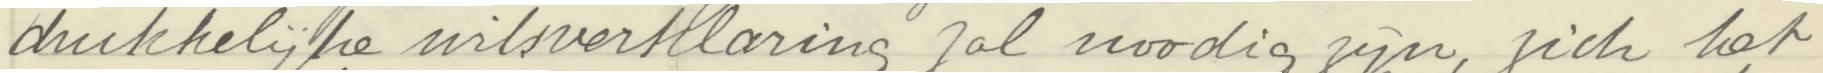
drukkelijke wilsverklaring zal noodig zijn, zich het
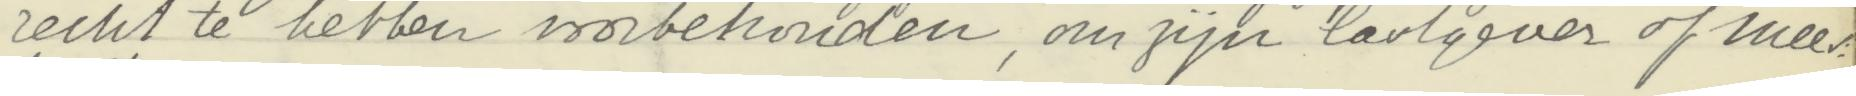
recht te hebben voorbehouden, om zijn lastgever of mees
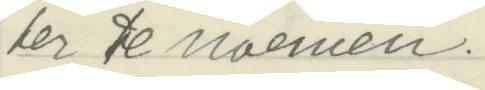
ter te noemen.
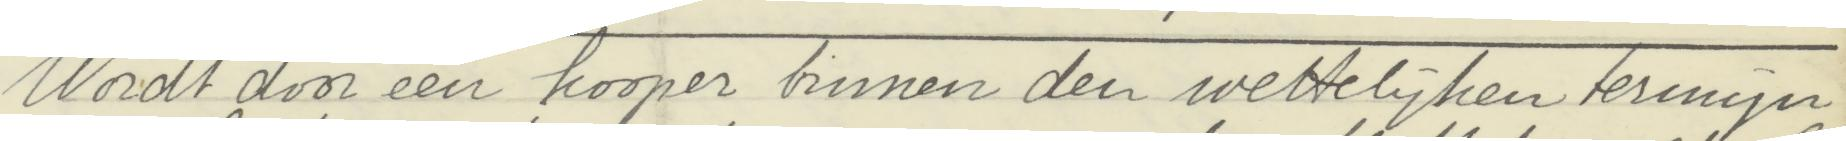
Wordt door een kooper binnen den wettelijken termijn
